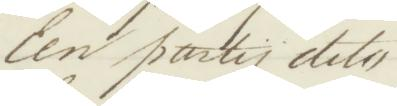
Een partij dito
